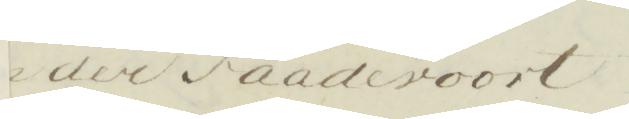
der Paadevoort
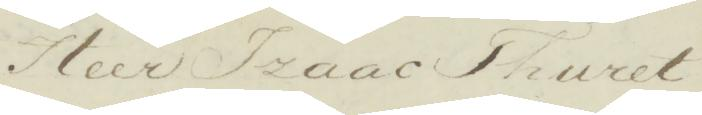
Heer Izaac Thuret
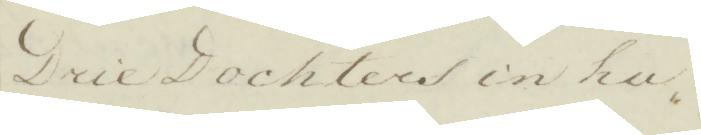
Drie Dochters in hu„
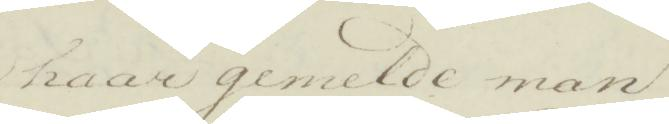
haar gemelde man
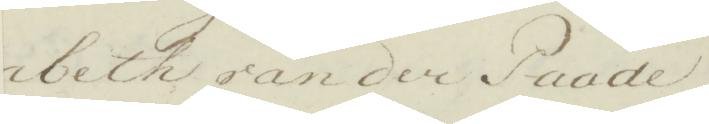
beth van der Paade
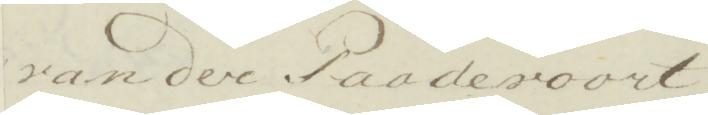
van der Paadevoort,
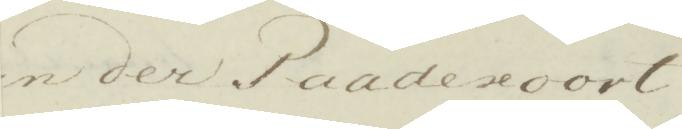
n der Paadevoort
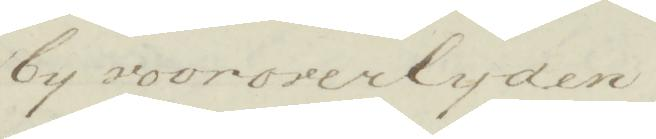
by vooroverlyden
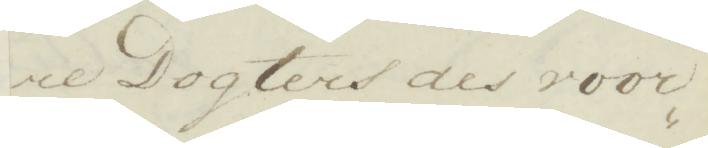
re Dogters des voor„
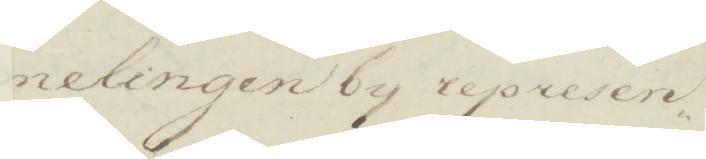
elingen by represen„
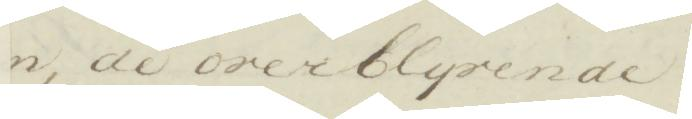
n, de over blyvende
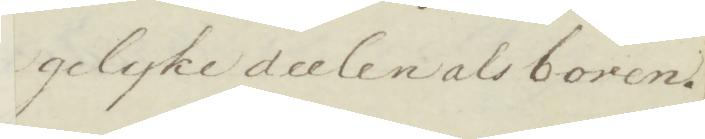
gelyke deelen als boven.
